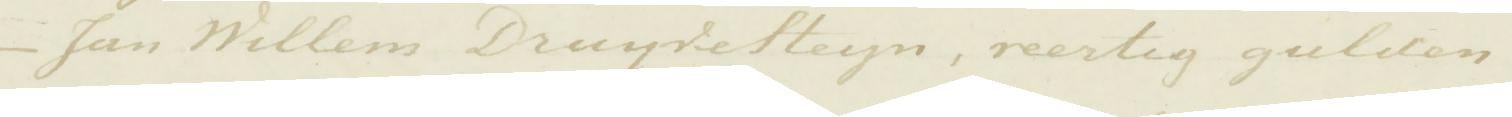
—Jan Willem Druyvesteijn, veertig gulden
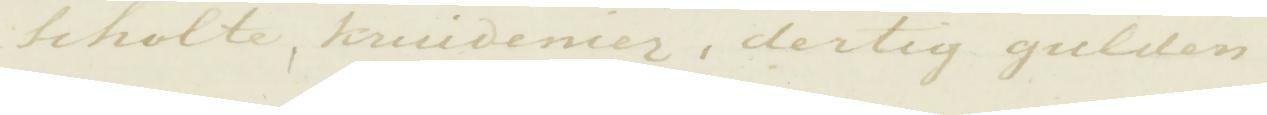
scholte, kruidenier, dertig gulden
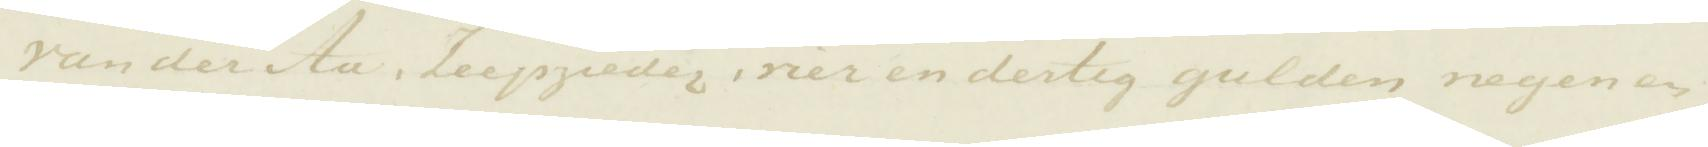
van der Aa, Zeepzieder, vier en dertig gulden negen en
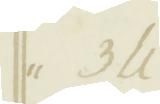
„ 34
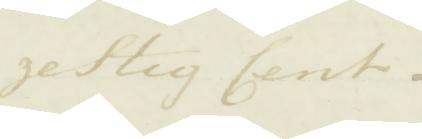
zestig Cent.
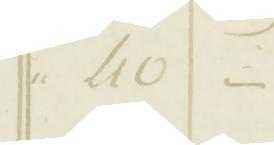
„ 40—
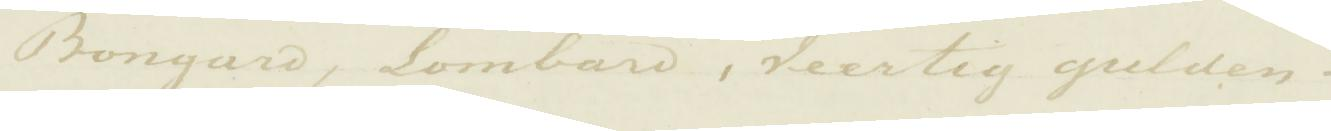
Bongard, Lombard, Veertig gulden.
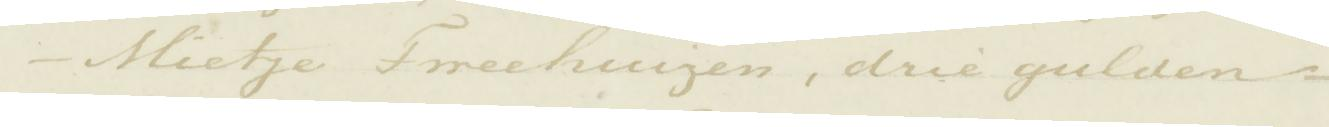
Mietje Tweehuizen, drie gulden
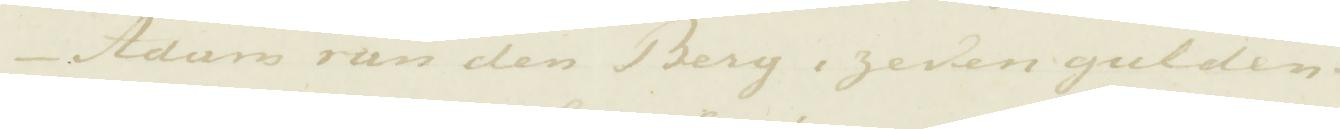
Adam van den Berg, zeven gulden
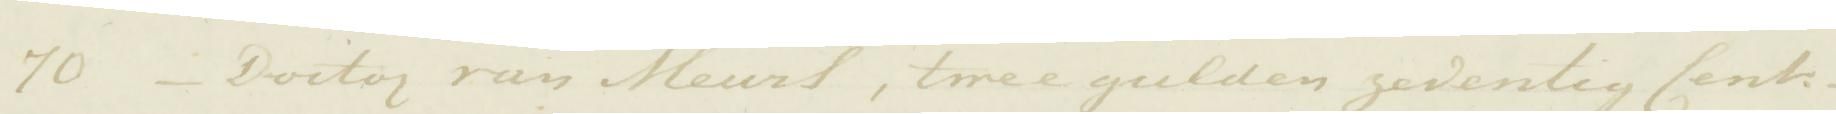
70 — Doctor van Meurs, twee gulden zeventig Cents.
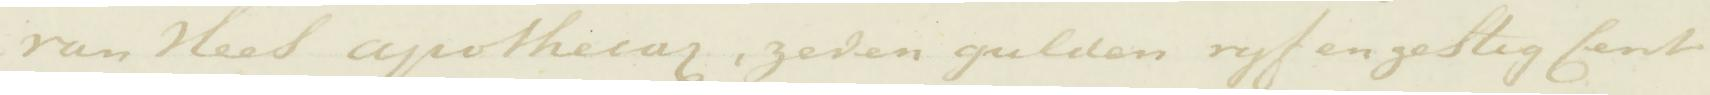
van Hees apothecar, zeven gulden vyf en zestig Cent
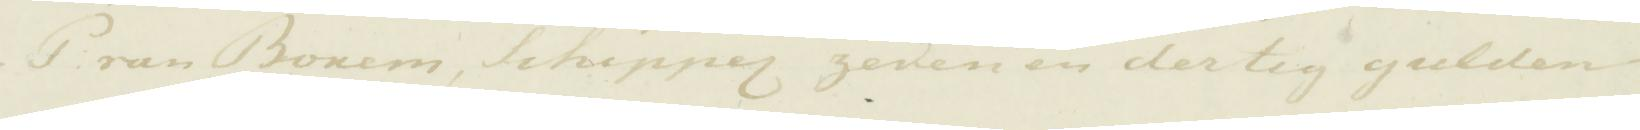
P: van Borem, schipper zeven en dertig gulden
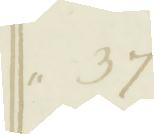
„ 37
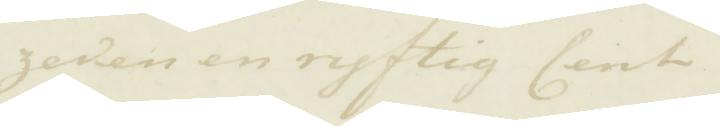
zeven en vyftig Cent.
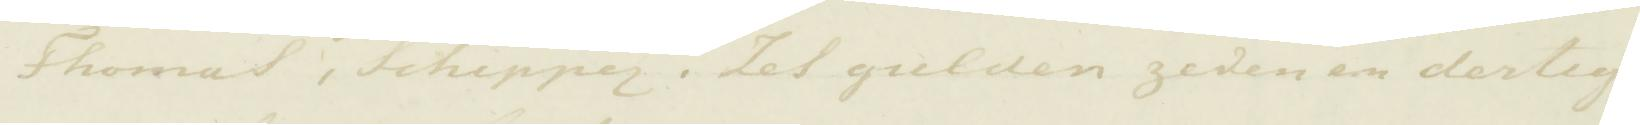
Thomas, schipper, zes gulden zeven en dertig
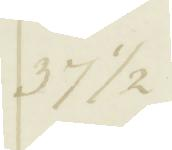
37½
